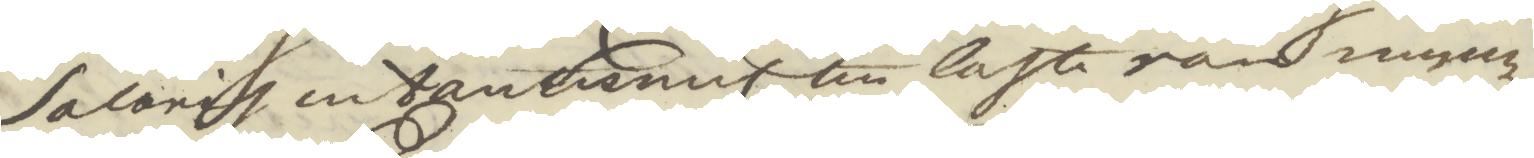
Salaris en tantismis ten laste van mynen
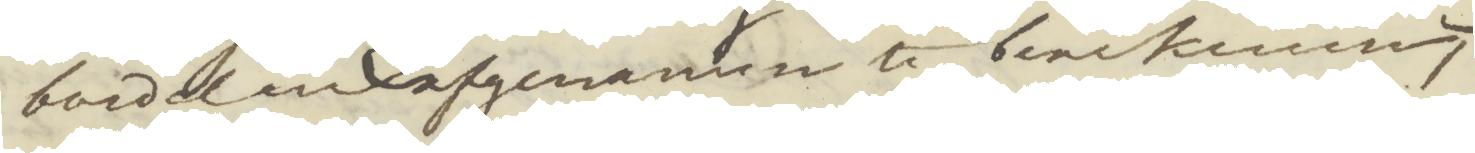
boedel en Erfgenamen te berekenen,
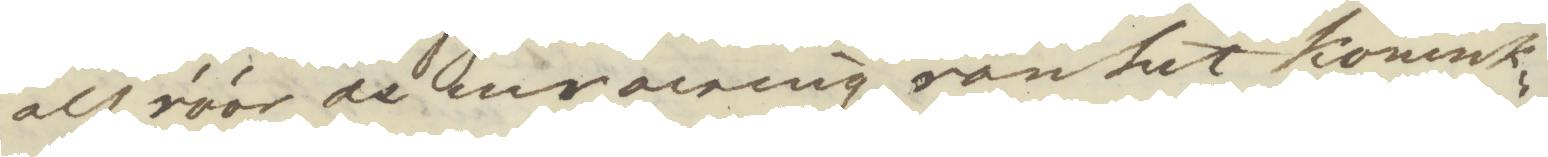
als voor de invoering van het Konink„
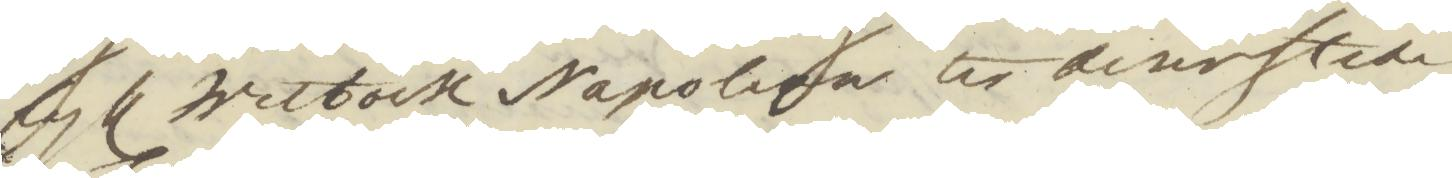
lyk Wetboek Napoleon ter deser stede
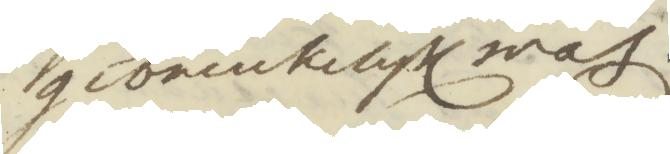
gebruikelyk was
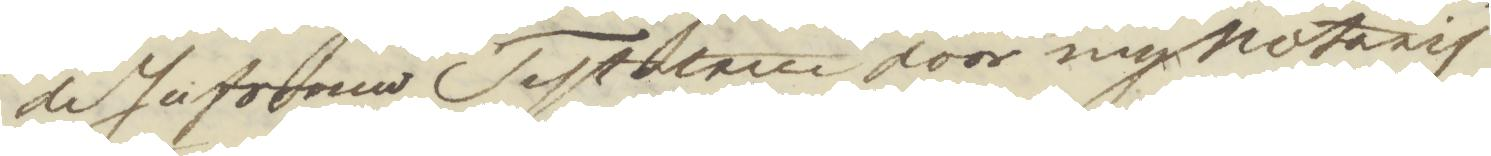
de Jufvrouw Testatrice door my notaris
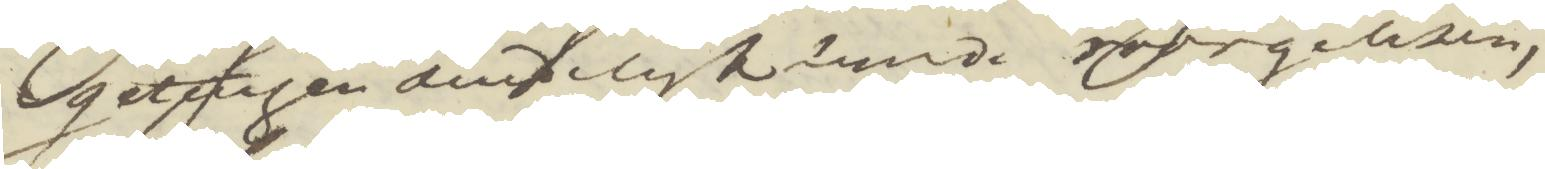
getuigen duidelyk zynde voorgelezen,
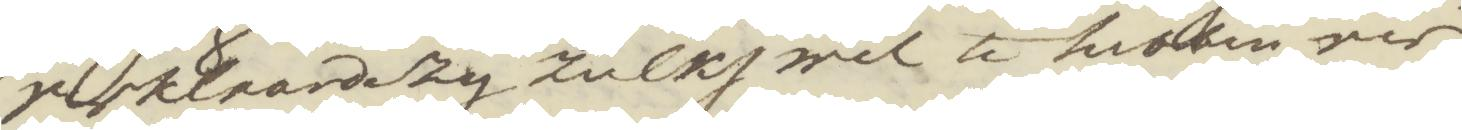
verklaarde zy zulks wel te hebben ver
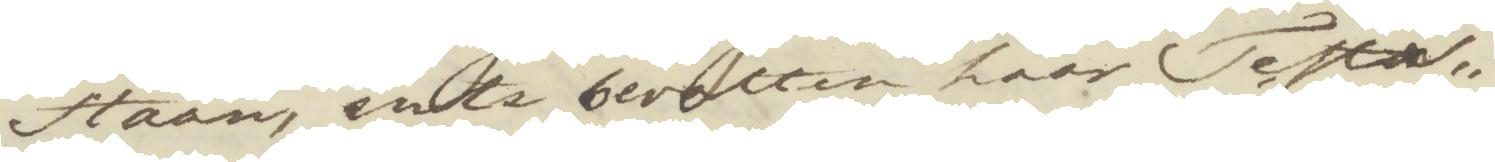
staan, en te bevatten haar Testa„
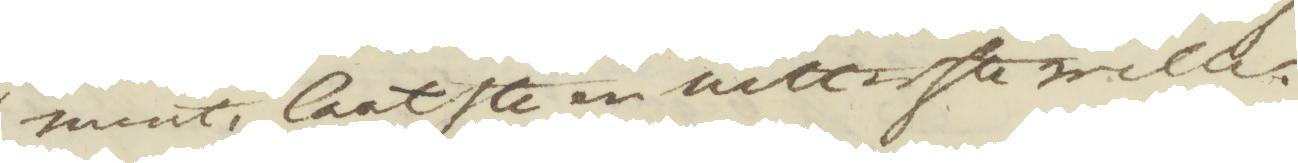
ment: laatste en uitterste wille.
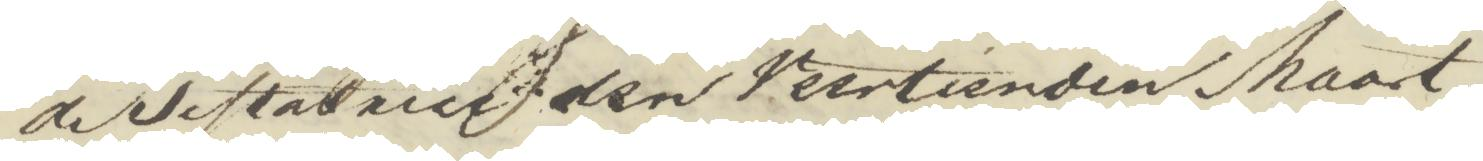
de Testatrice den Veertienden Maart
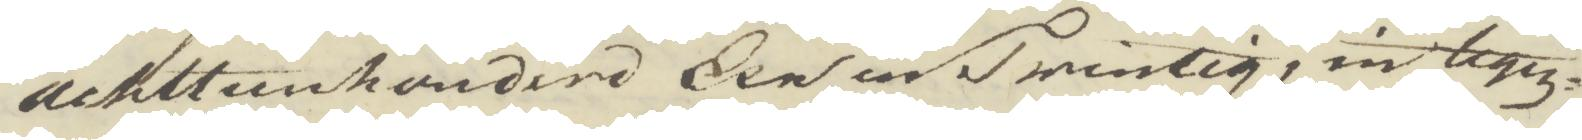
achttienhonderd Een en Twintig, in tegen„
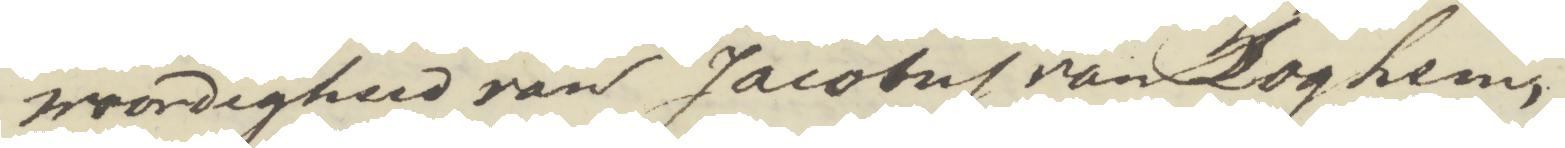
woordigheid van Jacobus van Loghem,
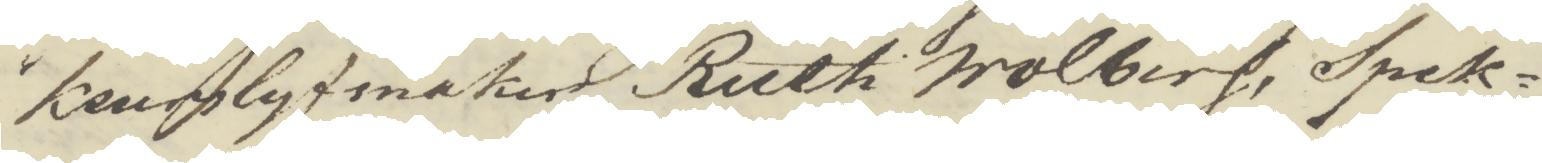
keurslyfmaker, Ruth Wolbers, spek„
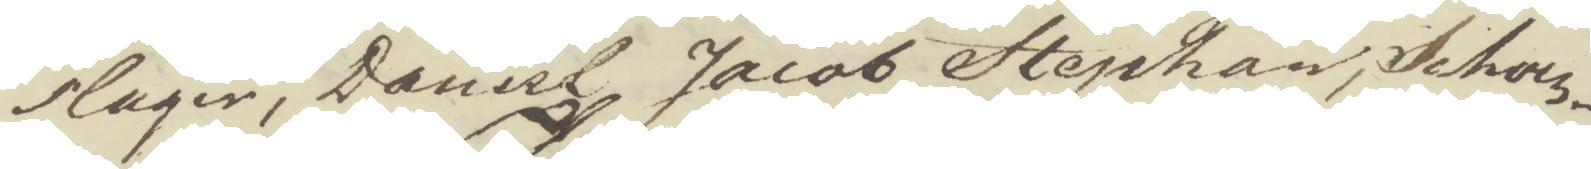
slager, Daniel Jacob Stephan, Schoren„
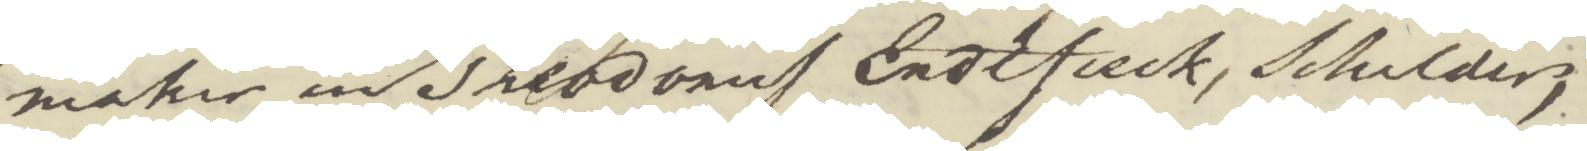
maker en Theodorus Erdtsieck, Schilder,
